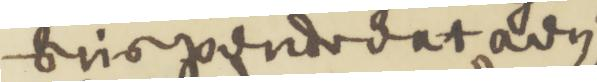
suspendeert aen
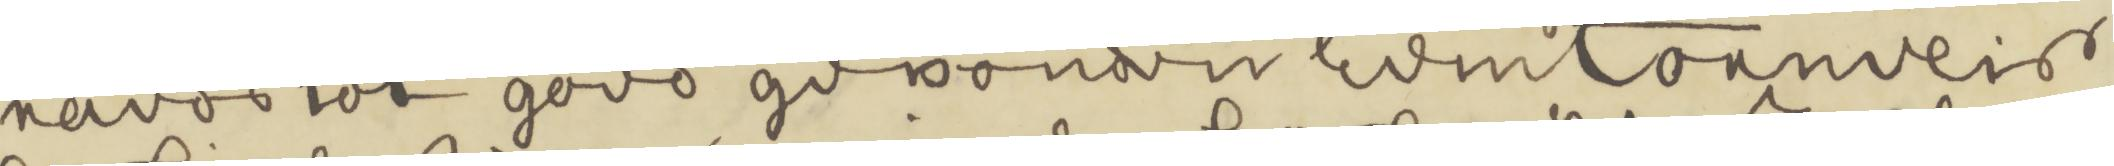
raeds tot goed gevonden hem Cornelis
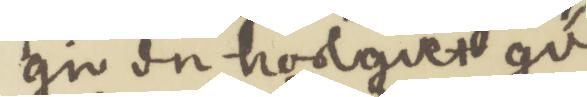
gie en kostgelt ge
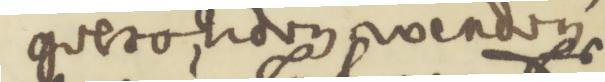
gehouden werden
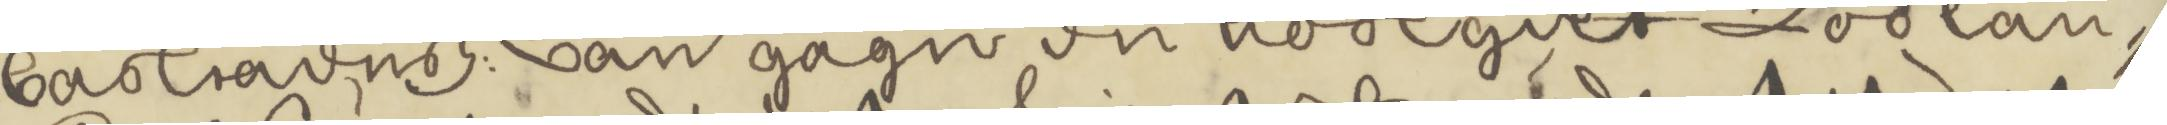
bastiaensz: van gagie en kostgelt zoo lan„
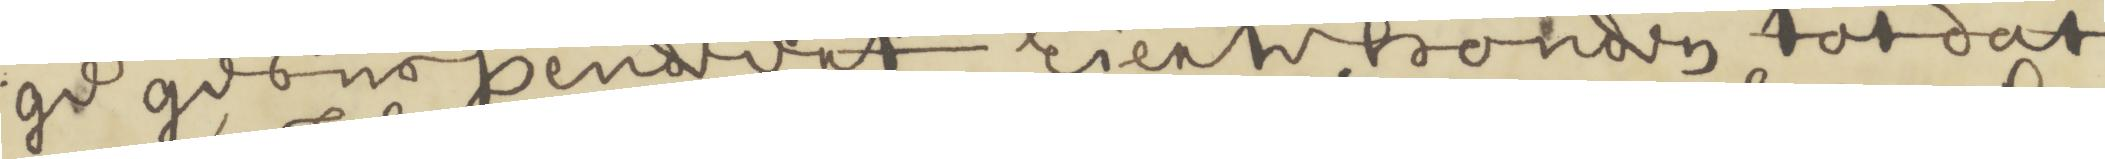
ge gesuspendeert hier te houden tot dat
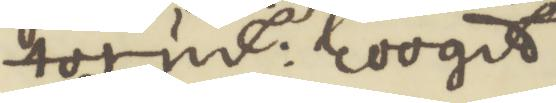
tot uE: hoogEd:s
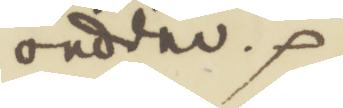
ordere.
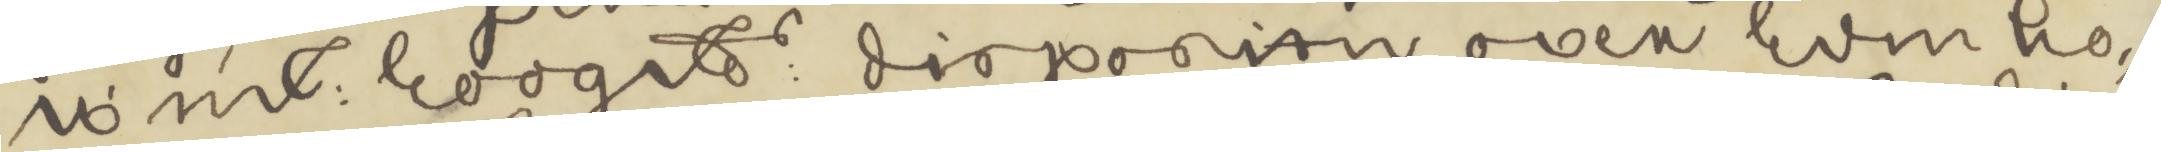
w' uE: hoogEd:s dispositie over hem ko„
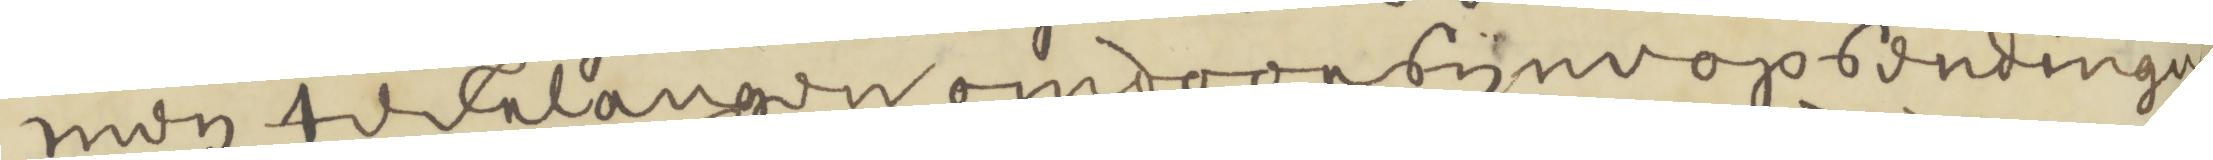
men te Erlangen omdoor sijne opsendinge
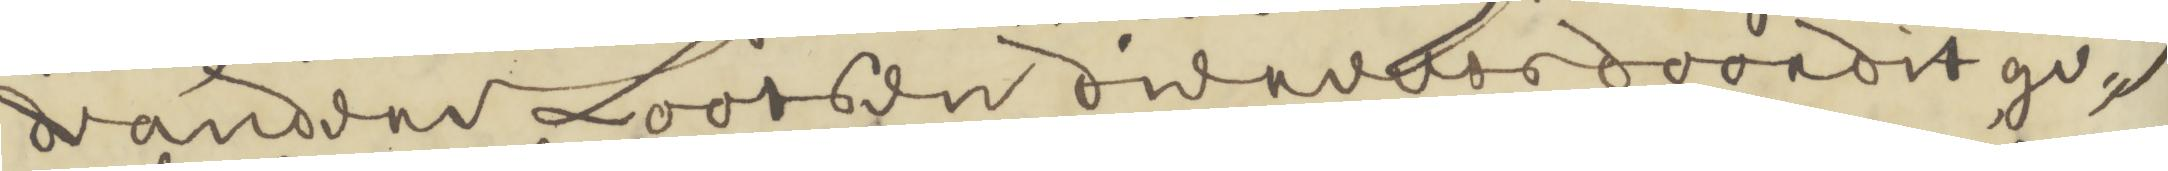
de andere Lootsen die reets door dit ge„
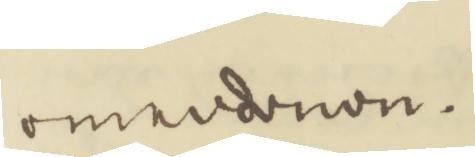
om redenen.
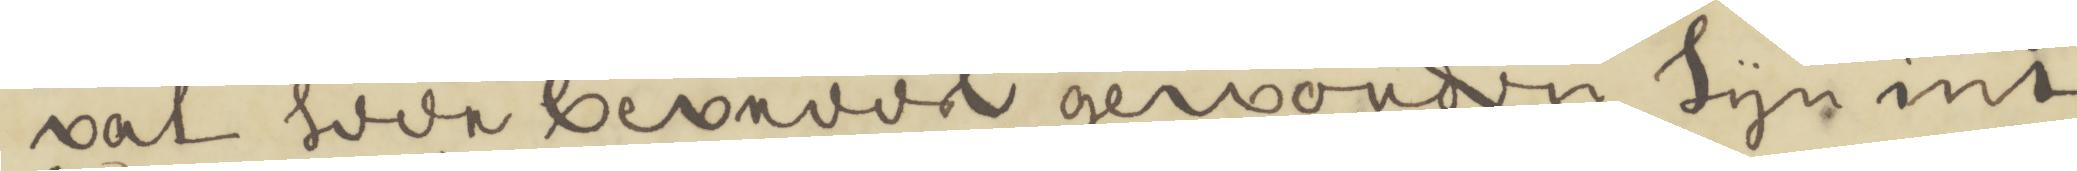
val seer bevreest geworden sijn in't
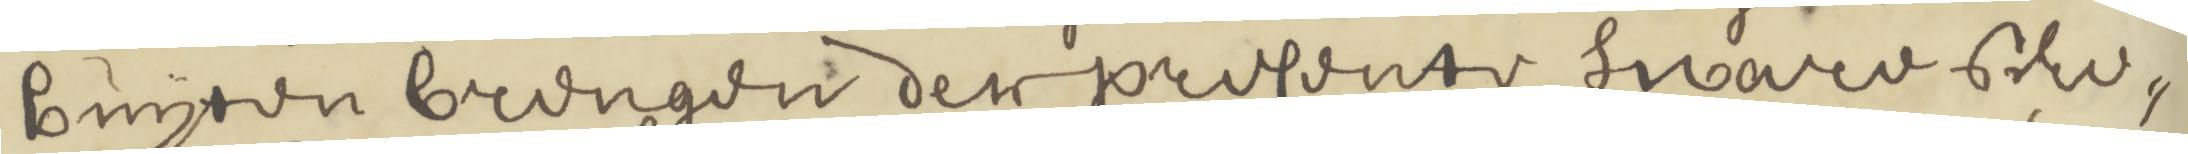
buijten brengen der presente sware sche„
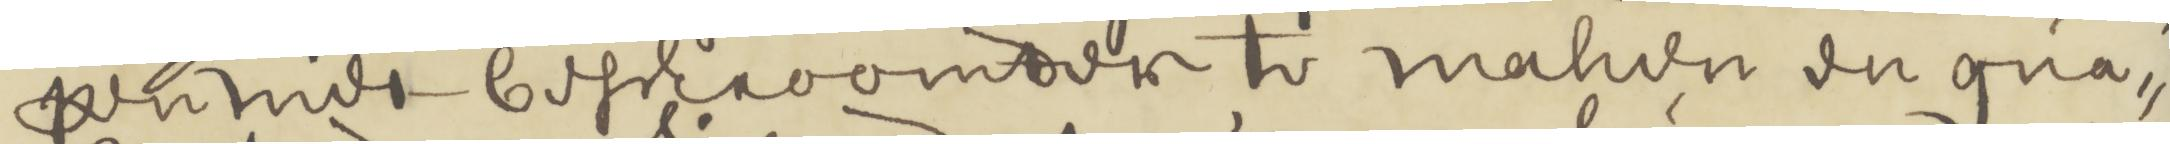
pen niet beschroomder te maken en qua„
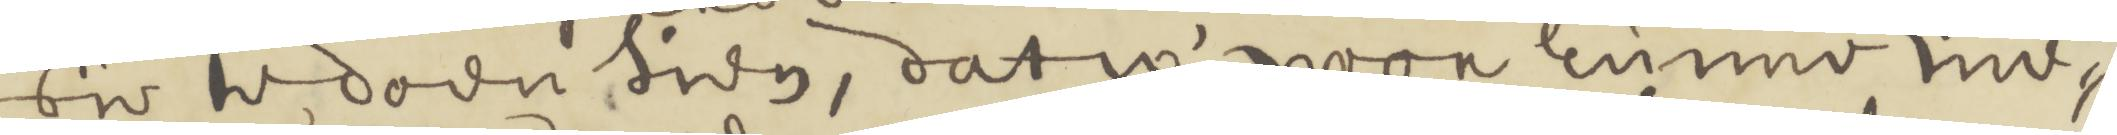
sie te doen sien, dat w' voor hunne me„
